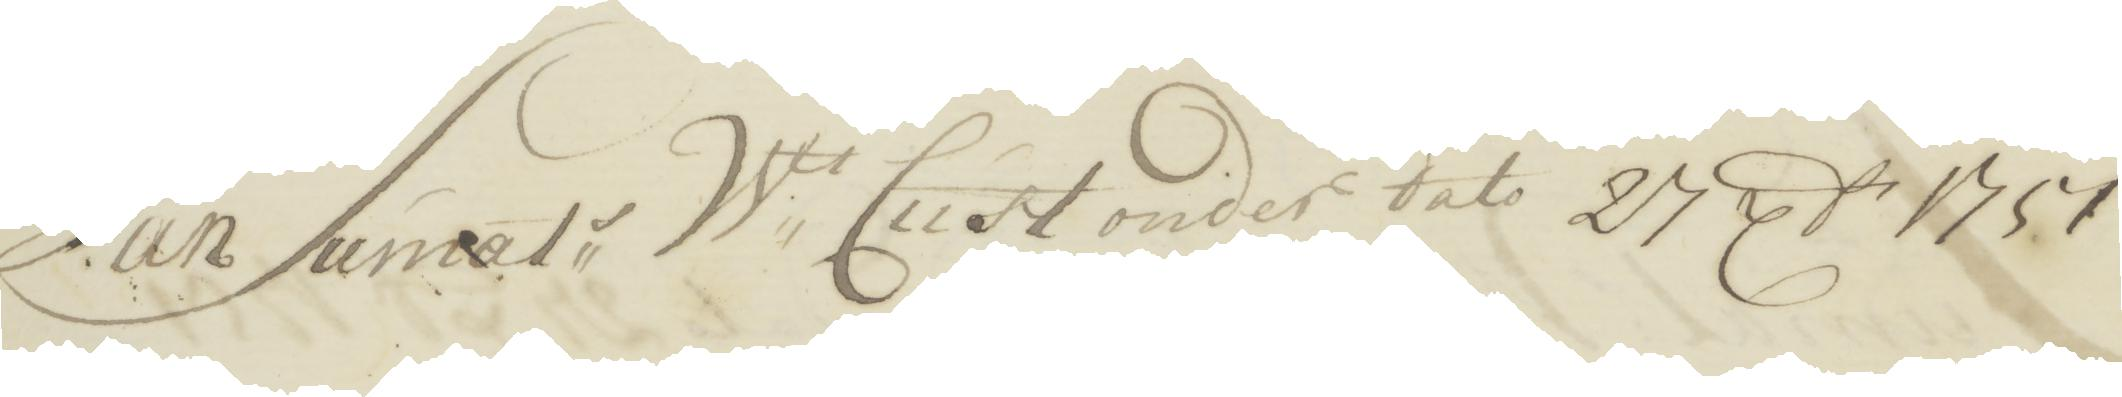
Van Sumat„s W„t Cust onder dato 27 xb:r 1751
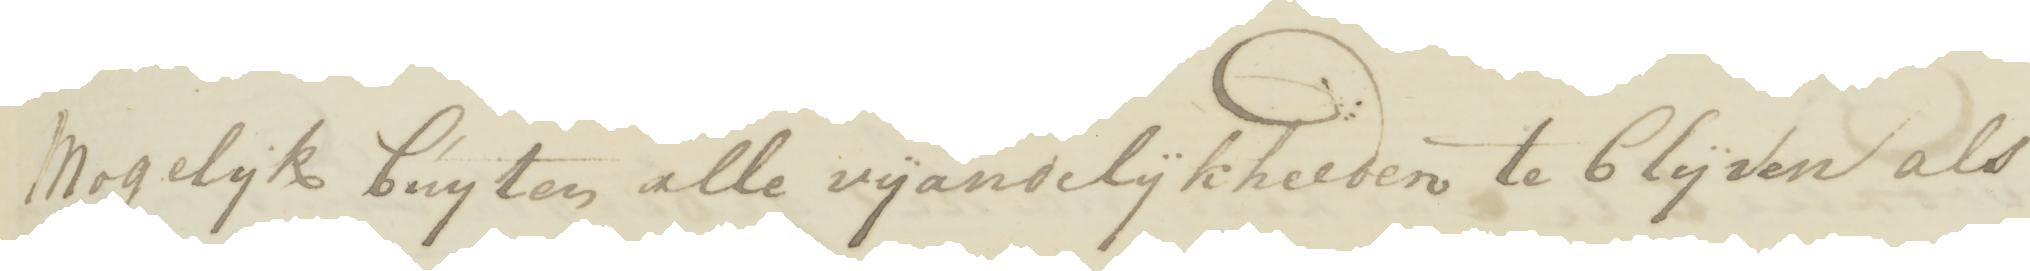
mogelijk buyten alle vijandelijkheeden te blijven als
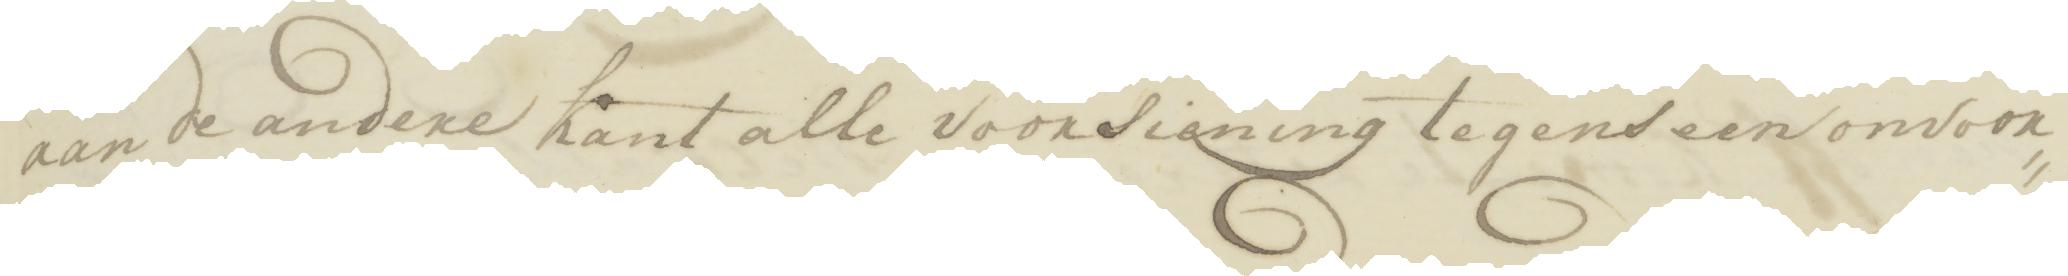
aan de andere kant alle voorsiening tegens een onvoor„
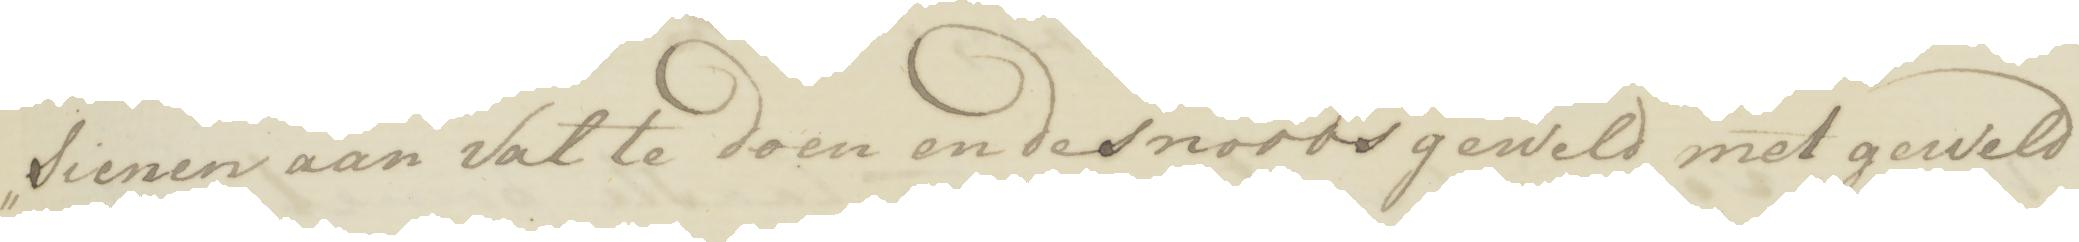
sienen aan valte doen en des noods geweld met geweld
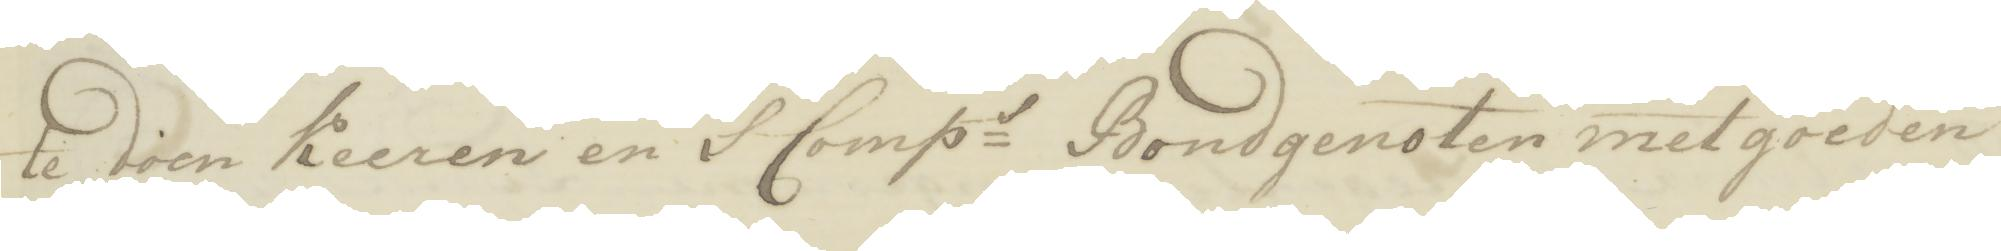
te doen keeren en ’s Comp=s Bondgenoten met goeden
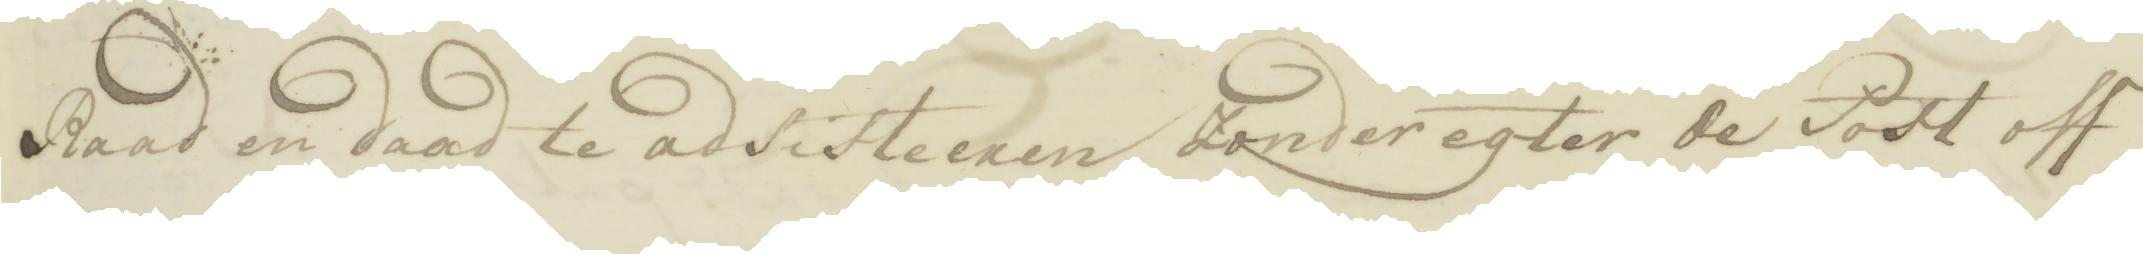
Raad en daad te adsisteeren, zonder egter de Post off
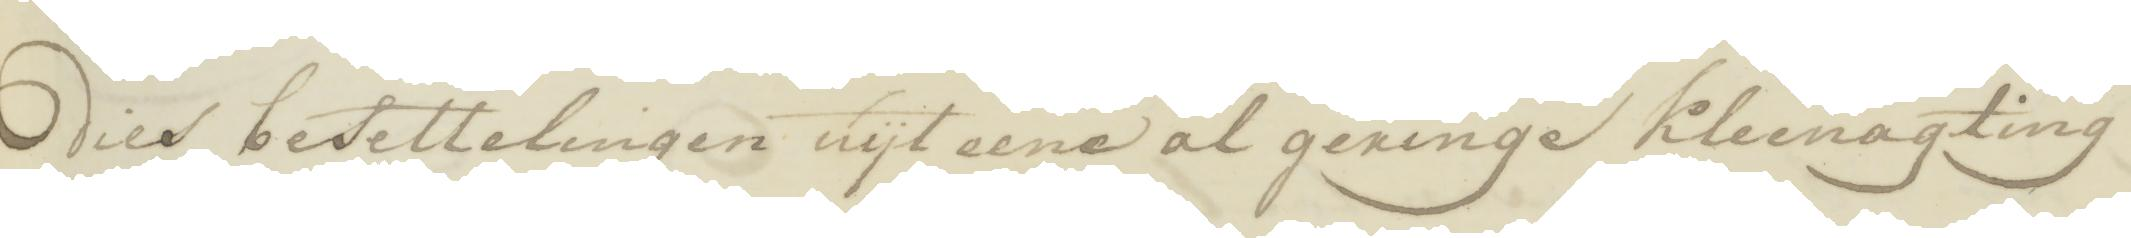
dies besettelingen uijt eene al geringe kleenagting
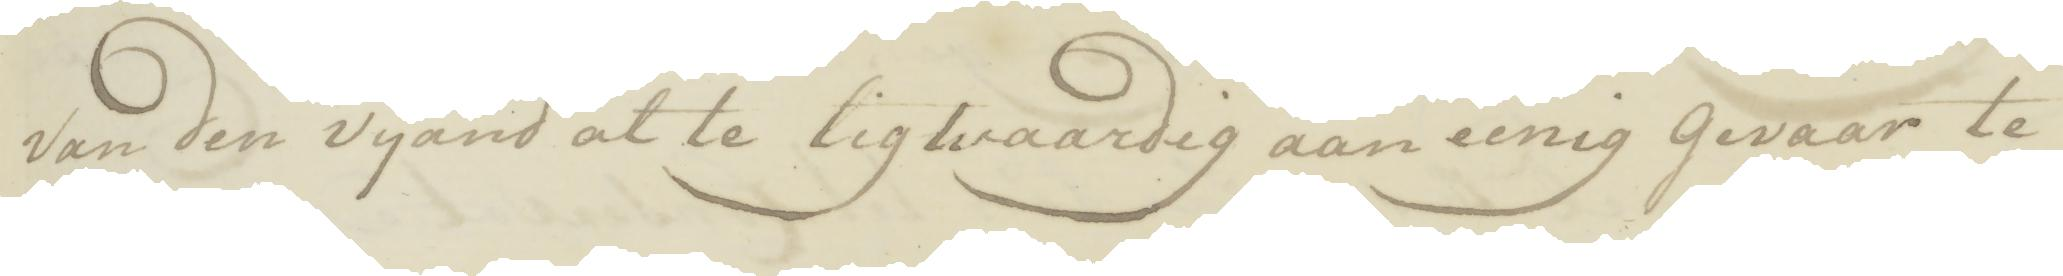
van den vijand al te ligtvaardig aan eenig gevaar te
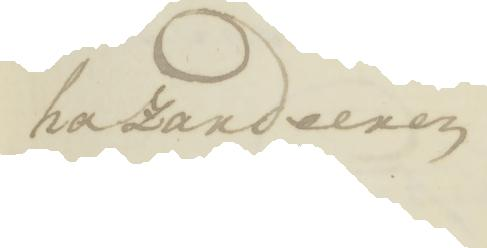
hazardeeren
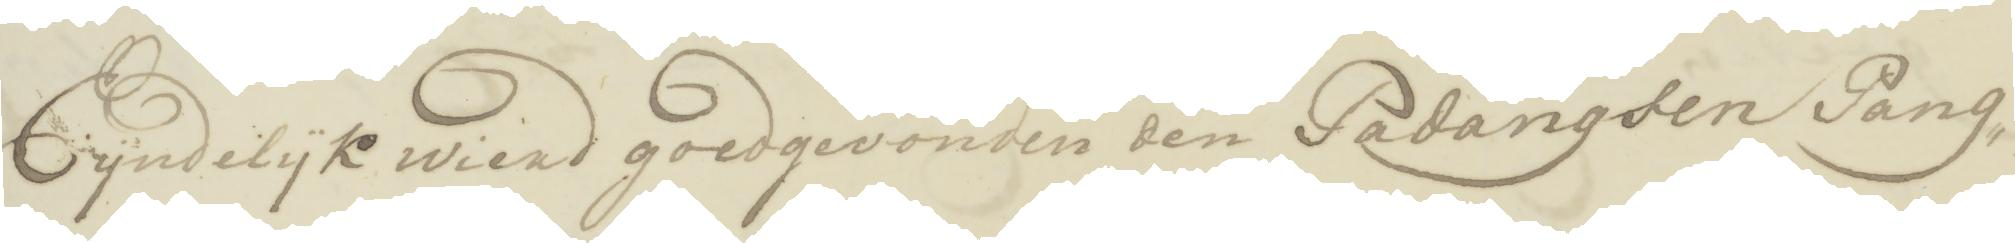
Eijndelijk wierd goedgevonden den Padangsen Pang„
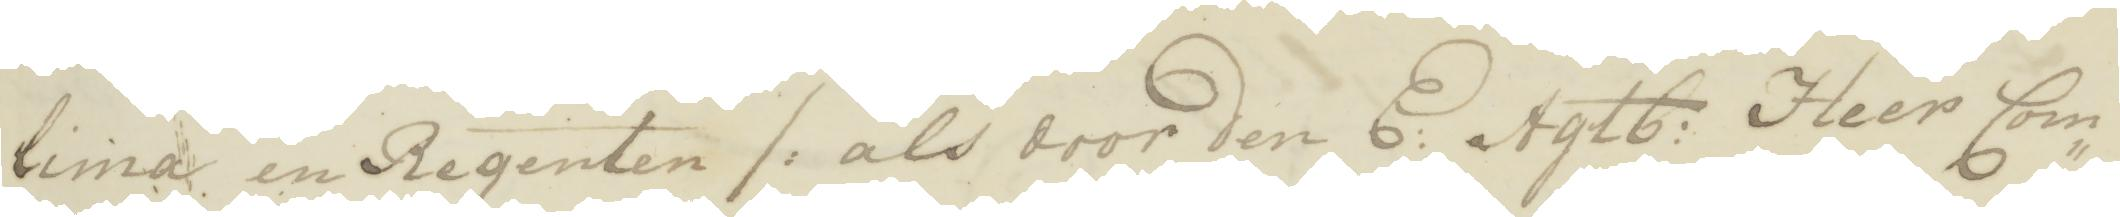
lima en Regenten /: als door den E: Agtb: Heer Com„
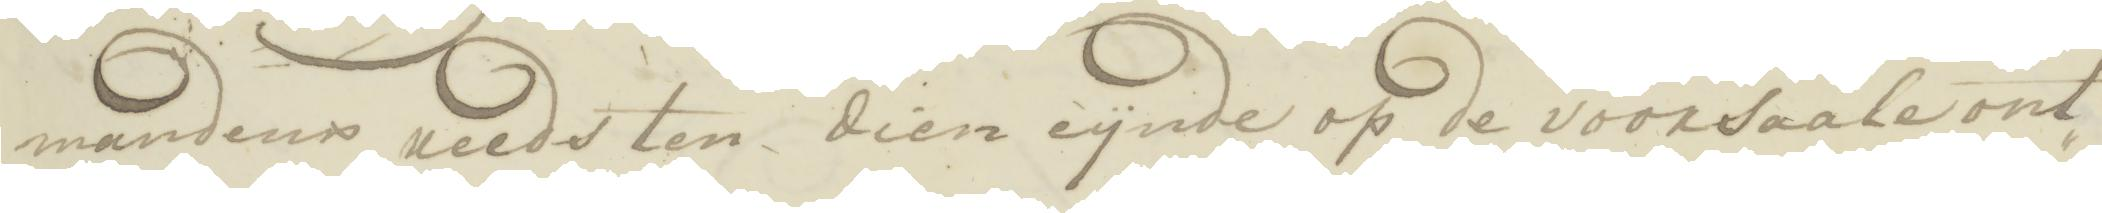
mandeur reeds ten dien eijnde op de voorsaale ont„
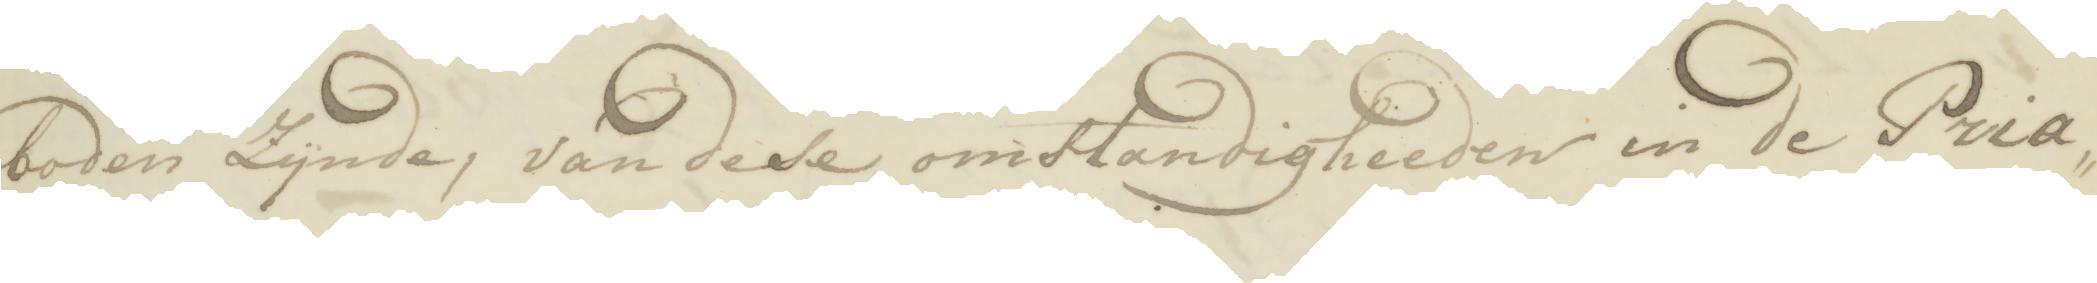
boden Zijnde, van dese omstandigheeden in de Pria„
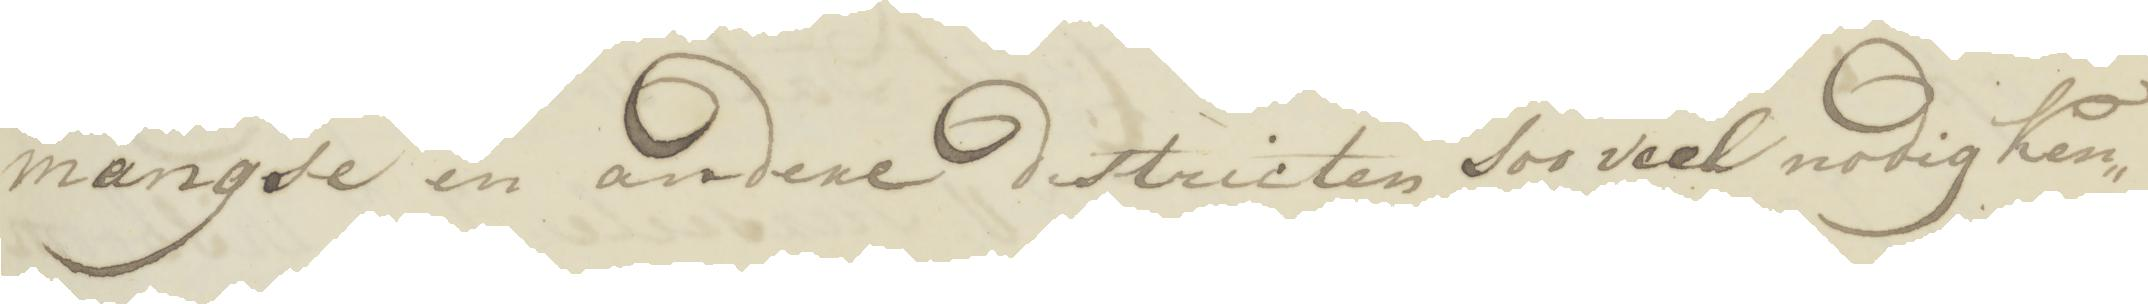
mangse en andere districten soo veel nodig ken„
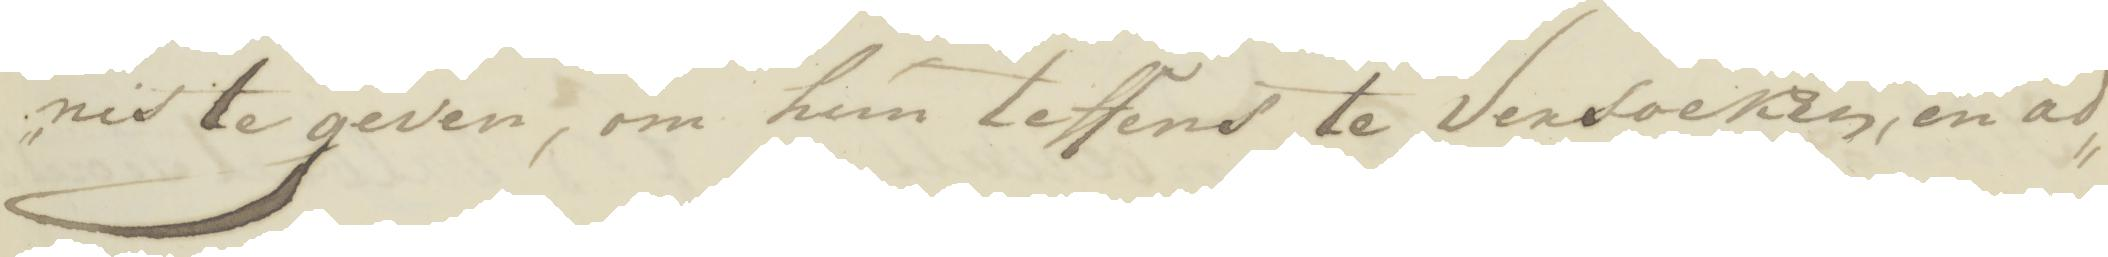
nis te geven, om hun teffens te versoeken, en ad„
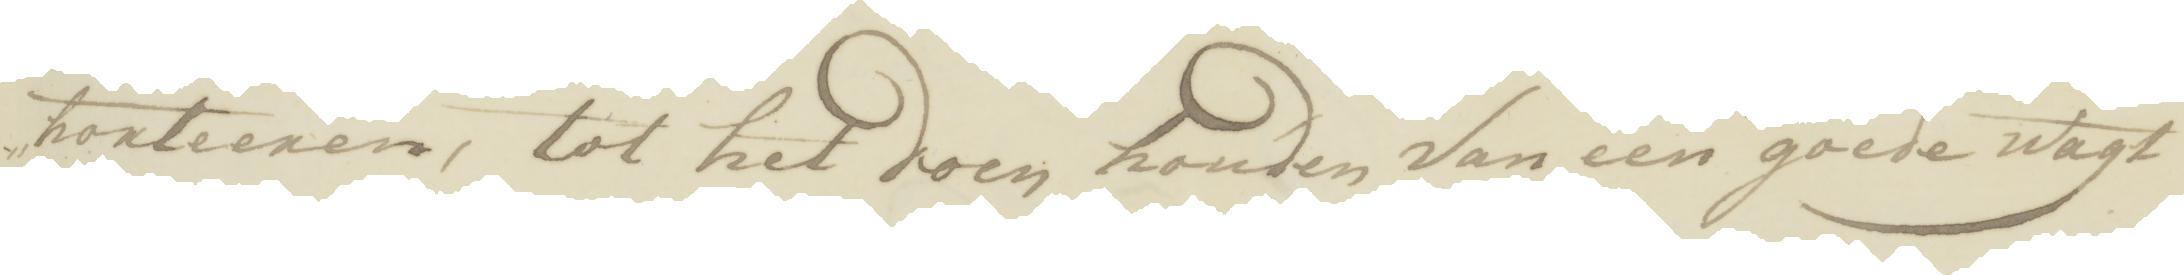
„horteeren, tot het doen houden van een goede wagt
